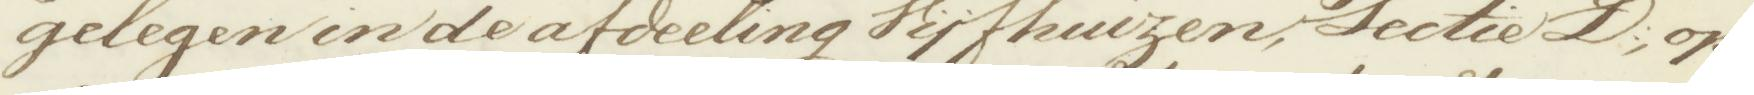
gelegen in de afdeeling Vijfhuizen, sectie D:, op
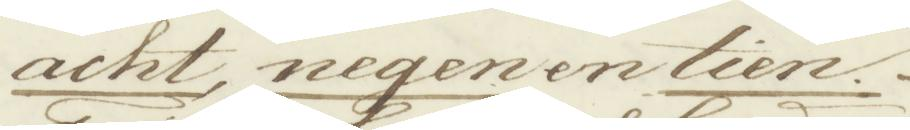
acht, negen en tien.
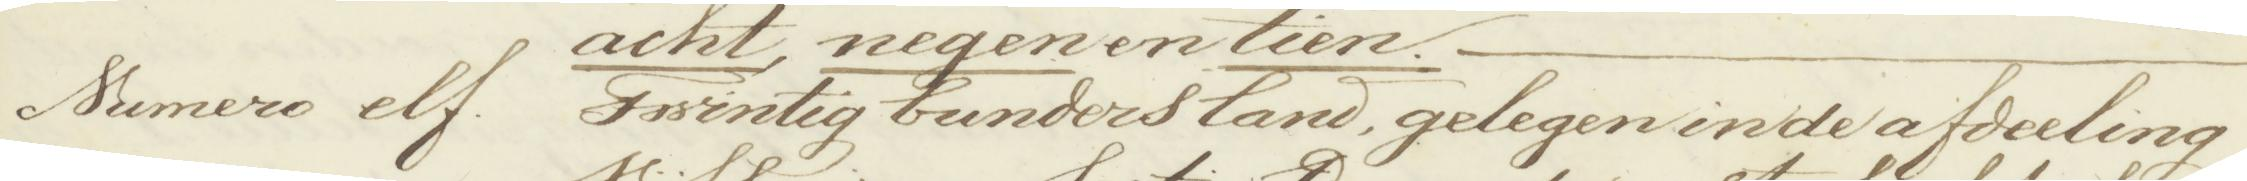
Numero elf. Twintig bunders land, gelegen in de afdeeling
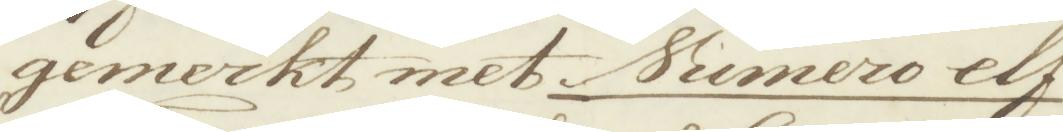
gemerkt met Numero elf
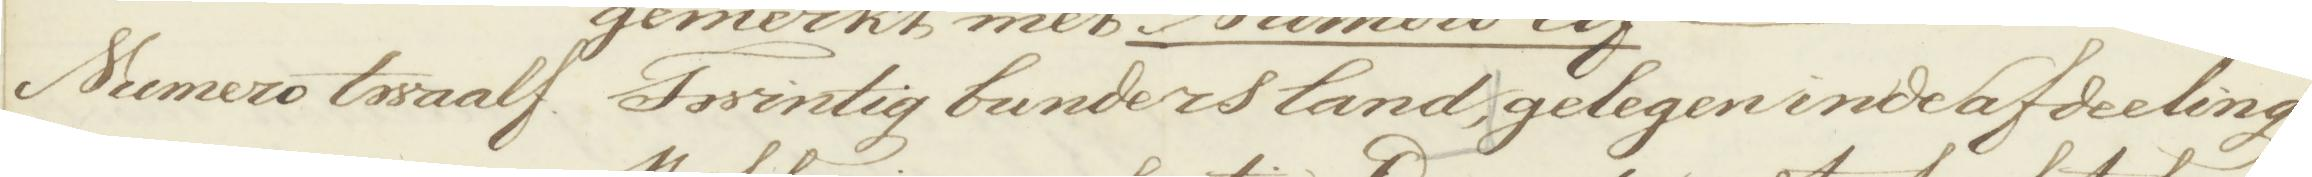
Numero twaalf. Twintig bunders land, gelegen in de afdeeling
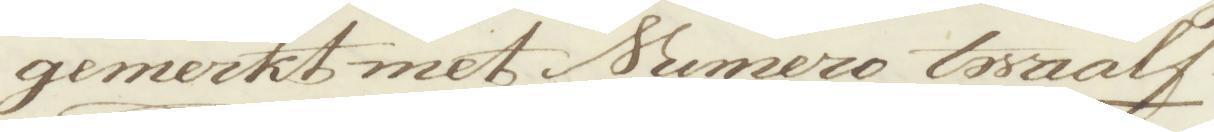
gemerkt met Numero twaalf
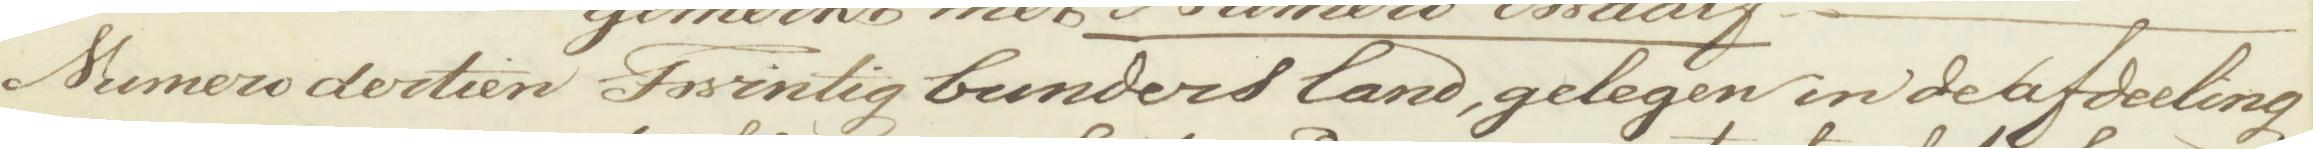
Numero dertien Twintig bunders land, gelegen in de afdeeling
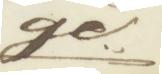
ge„
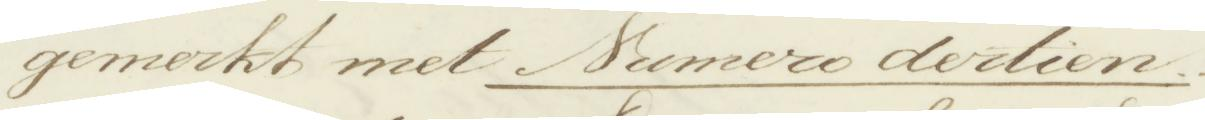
gemerkt met Numero dertien.
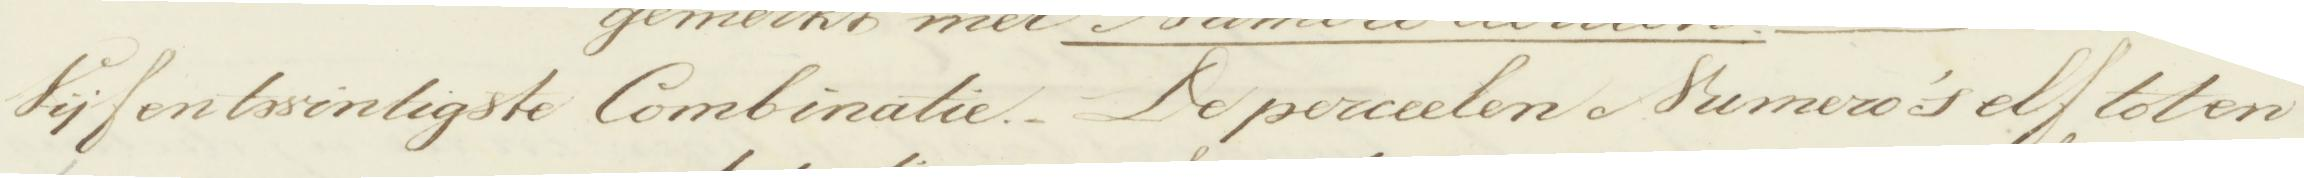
Vijf en twintigste Combinatie. - De perceelen Numero 's elf tot en
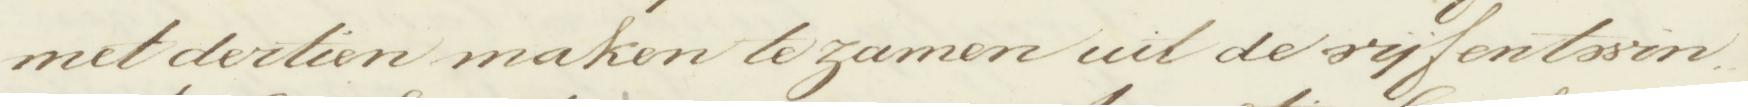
met dertien maken te zamen uit de vijf en twin„
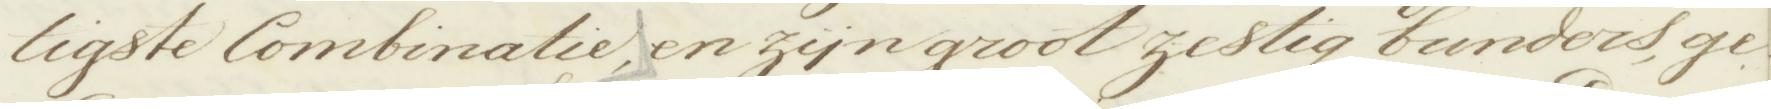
tigste Combinatie, en zijn groot zestig bunders ge„
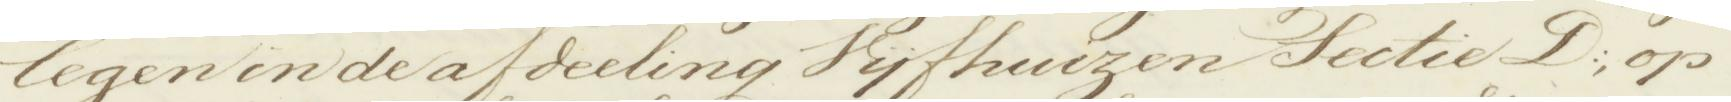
legen in de afdeeling Vijfhuizen Sectie D:, op
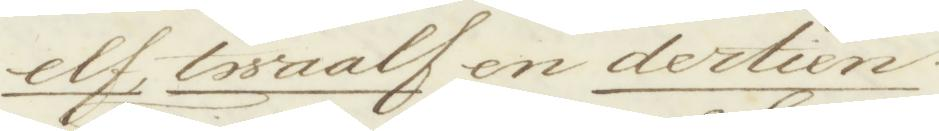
elf, twaalf en dertien
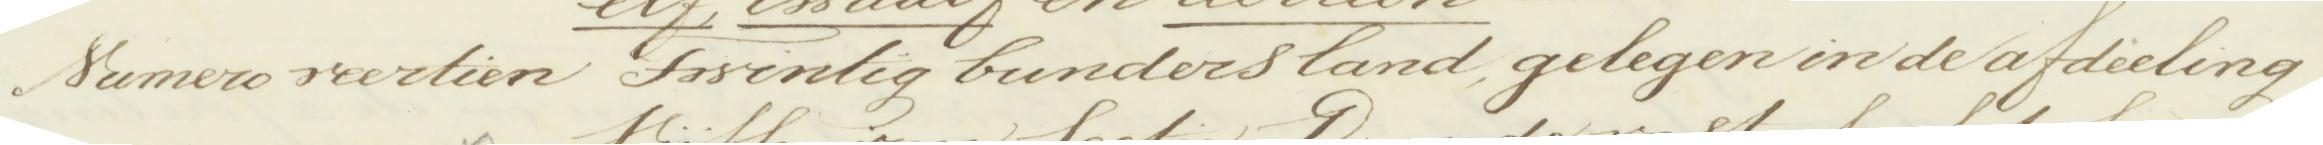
Numero veertien Twintig bunders land, gelegen in de afdeeling
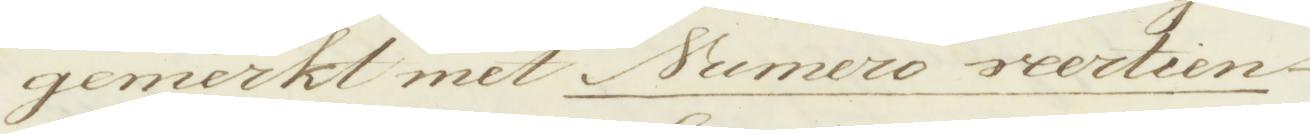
gemerkt met Numero veertien —
